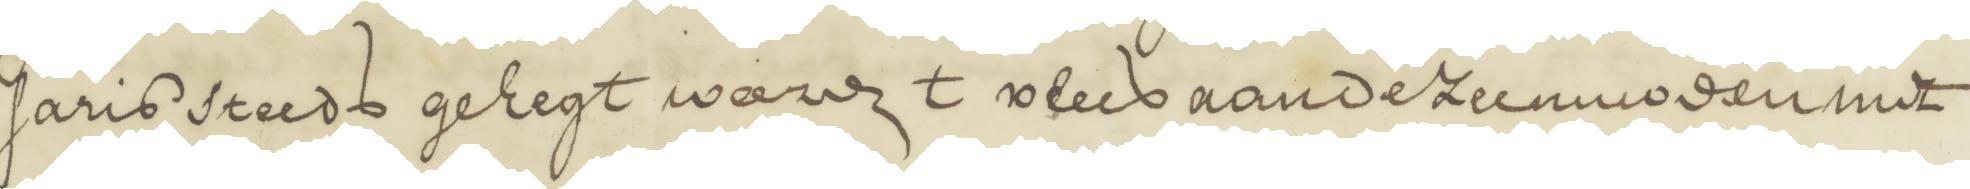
saris steeds gehegt weezen t vlees aan de zeenuwe en met
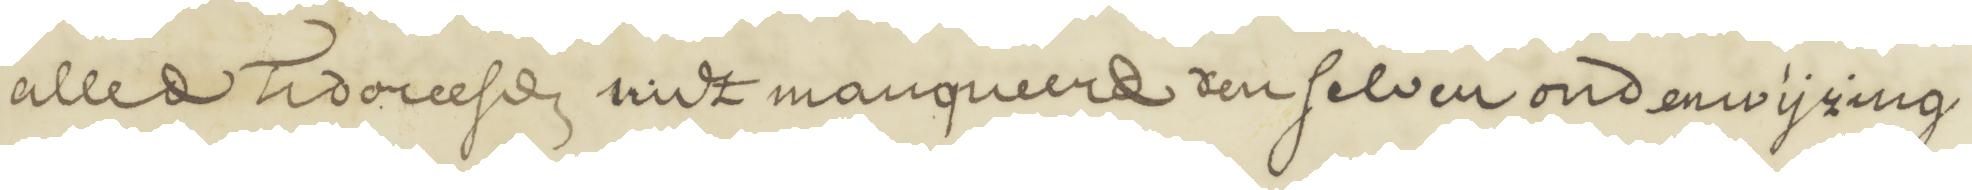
alle de Tidoreesen niet manqueerd den selven onderwijzing
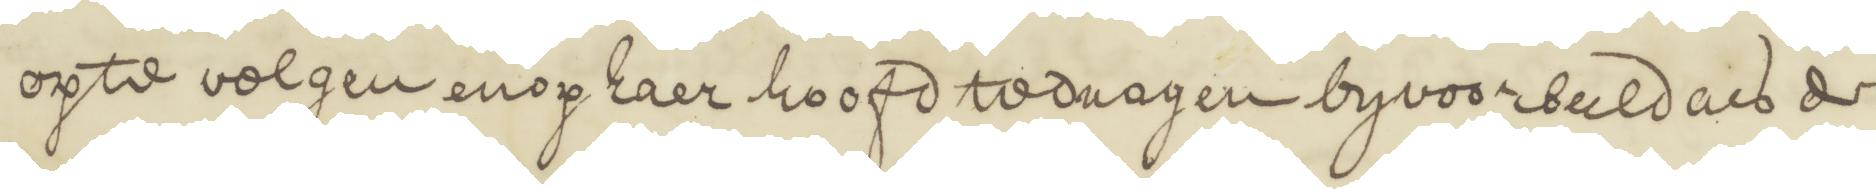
op te volgen en op haer hoofd te dragen byvoorbeeld als de
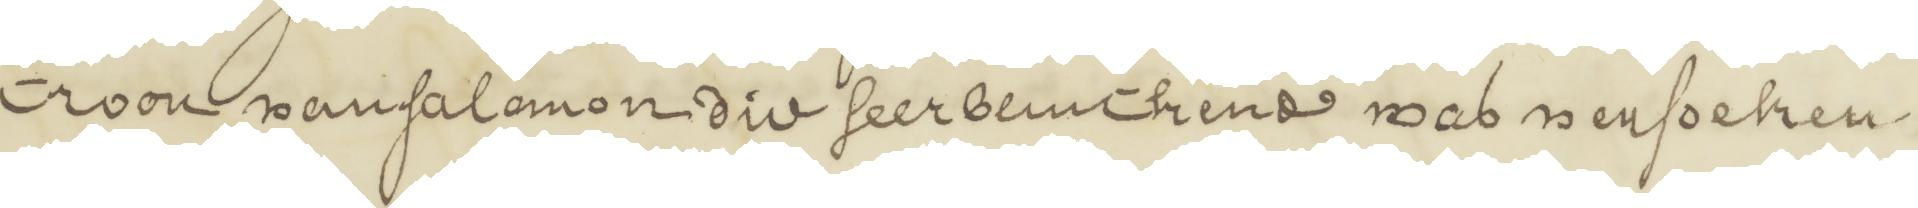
croon van salomon die seer blinckende was versoeken
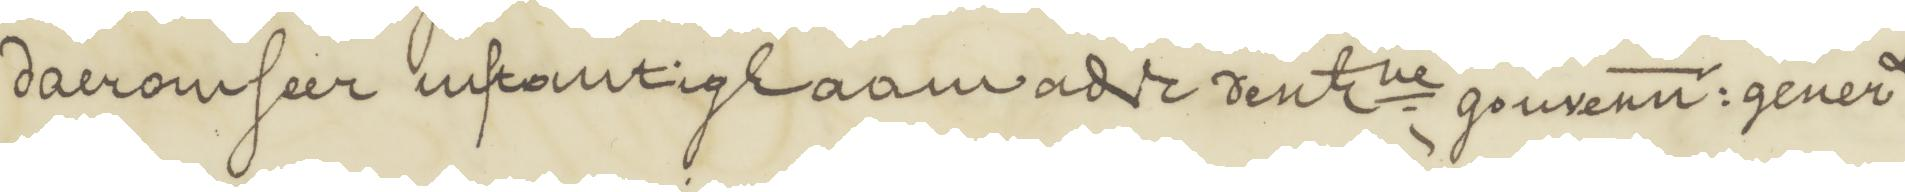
daerom seer instantigh aan vader denh=re gouvern:r gener
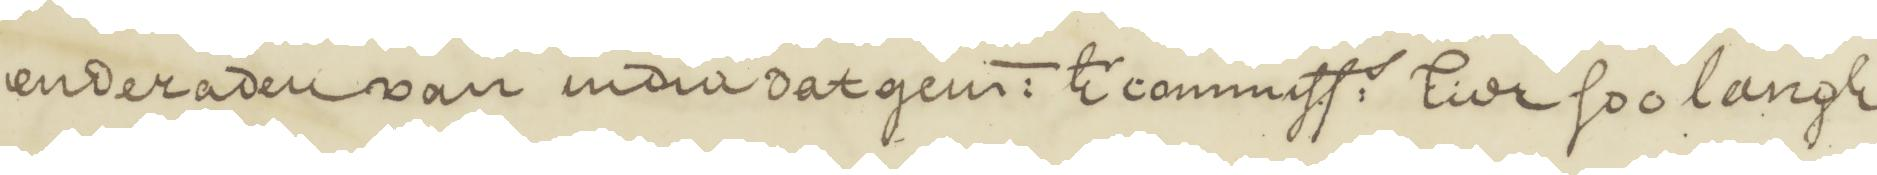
ende raden van india dat gem: hr commiss:s hier soo langh
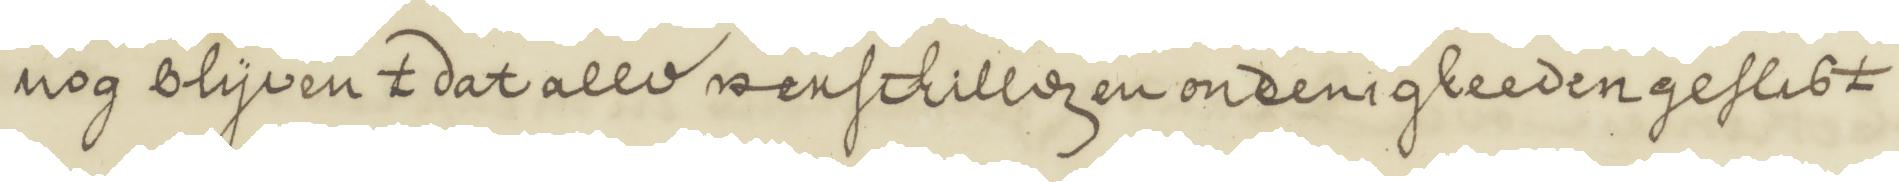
nog blijven t dat alle verschillen en oneenigheeden geslist
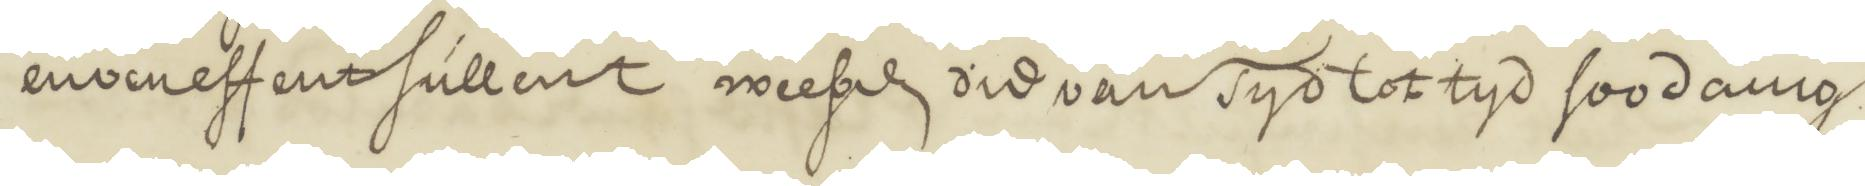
en vereffent sullent weesen die van Tyd tot tyd soodanig
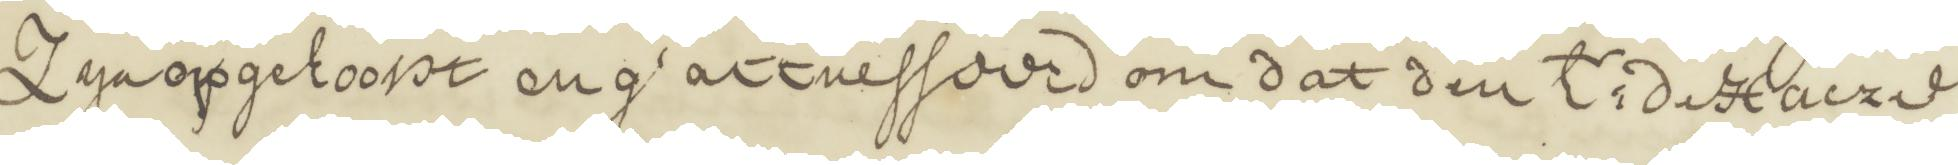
Zyn opgehoopt en g’accuesseerd om dat den h:r de Haeze
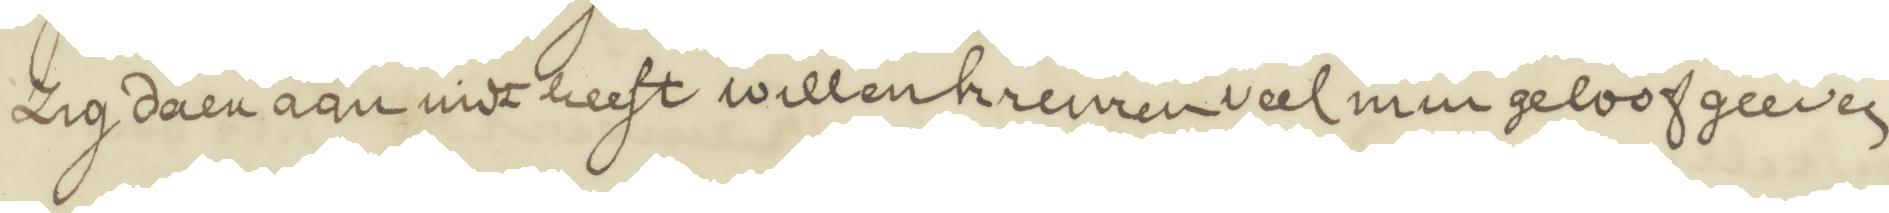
zig daer aan niet heeft willen kreuren veel min geloof geeven
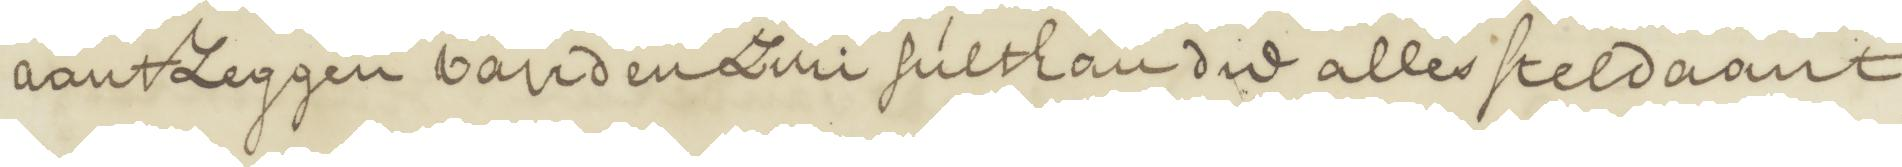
aant zeggen van den ziri sulthan die alles steld aant
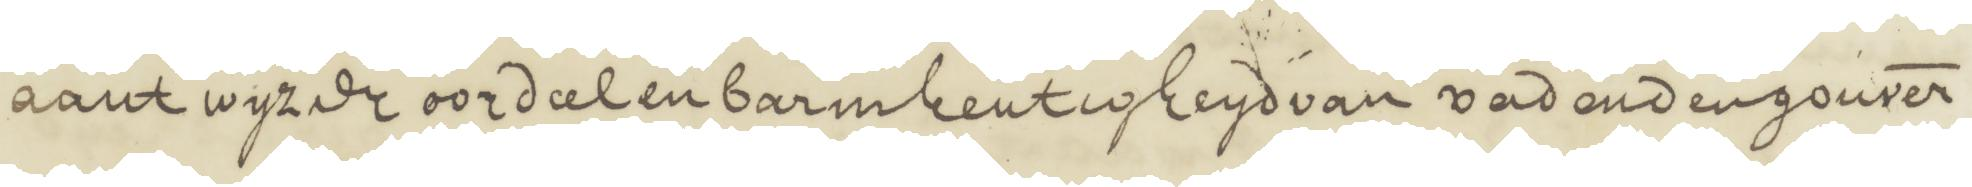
aant wijzer oordeel en barmhertigheyd van vaden der gouver
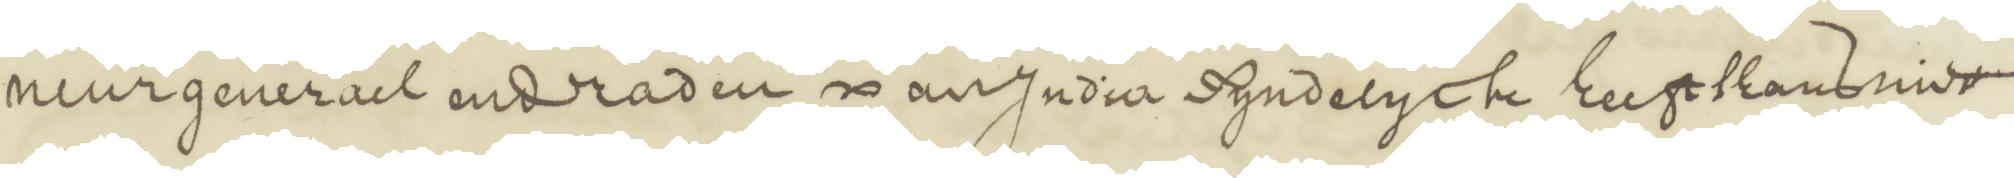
neur generael onderaden van Jndia Eyndelyck heeft thans niet
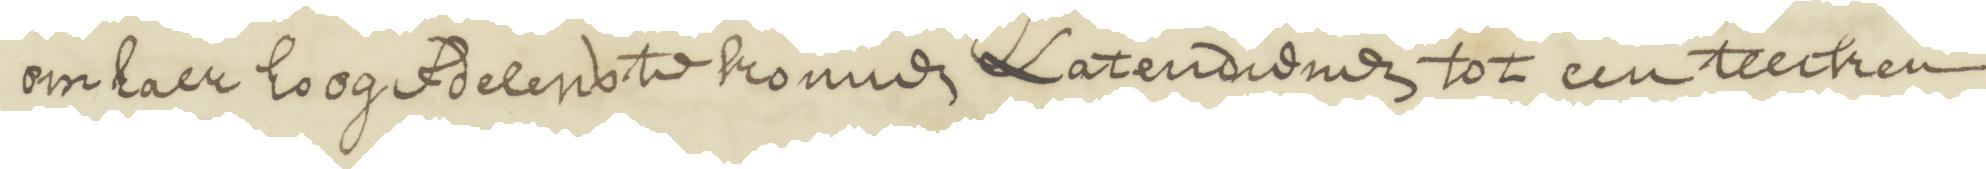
om haer hoog Edelens te konnen Laten dienen tot een teecken
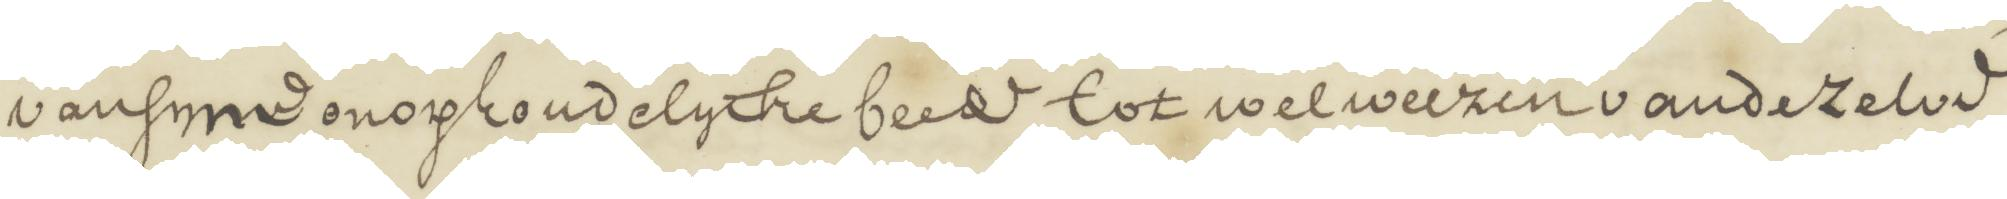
van syne onophoudelycke beede tot wel weezen van dezelve
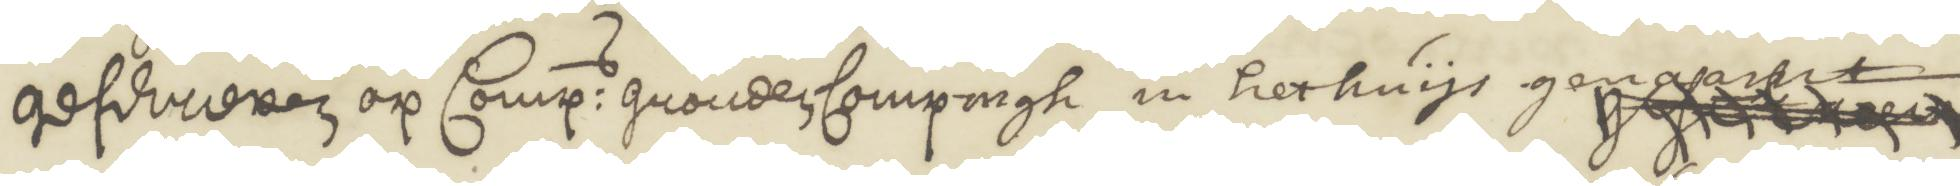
geschreven op Comp:s gronden Compargh in het huijs genaamt
